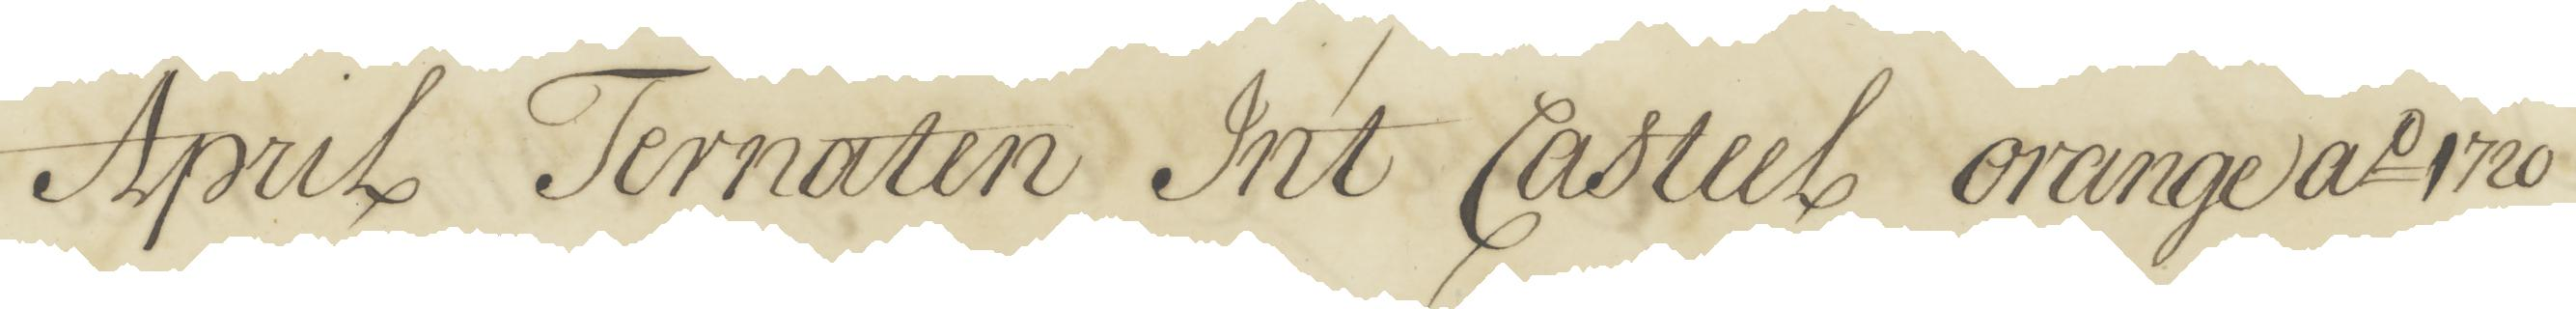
April Ternaten In't Casteel orange a=o 1720
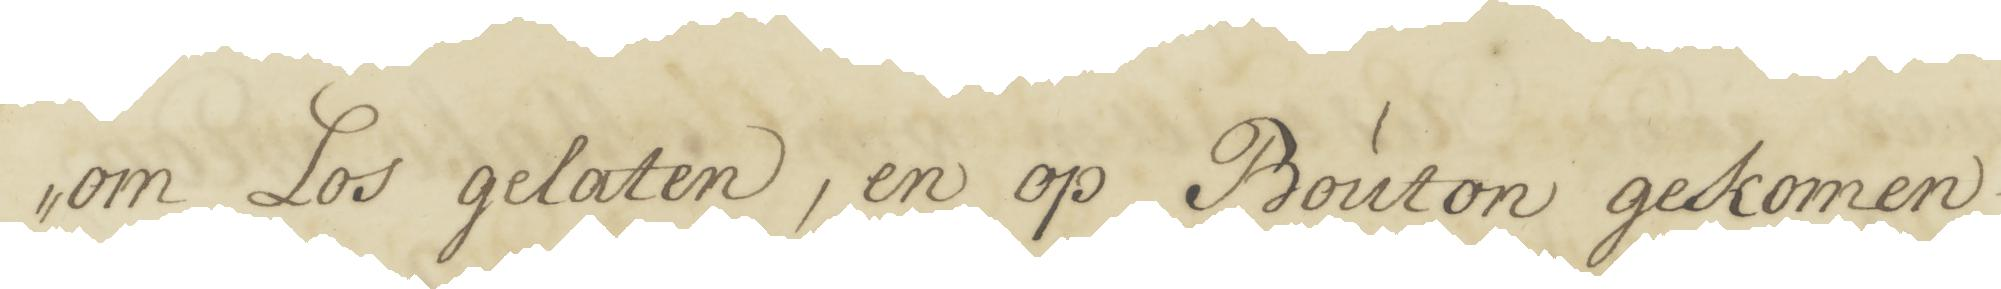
„om Los gelaten, en op Bouton gekomen
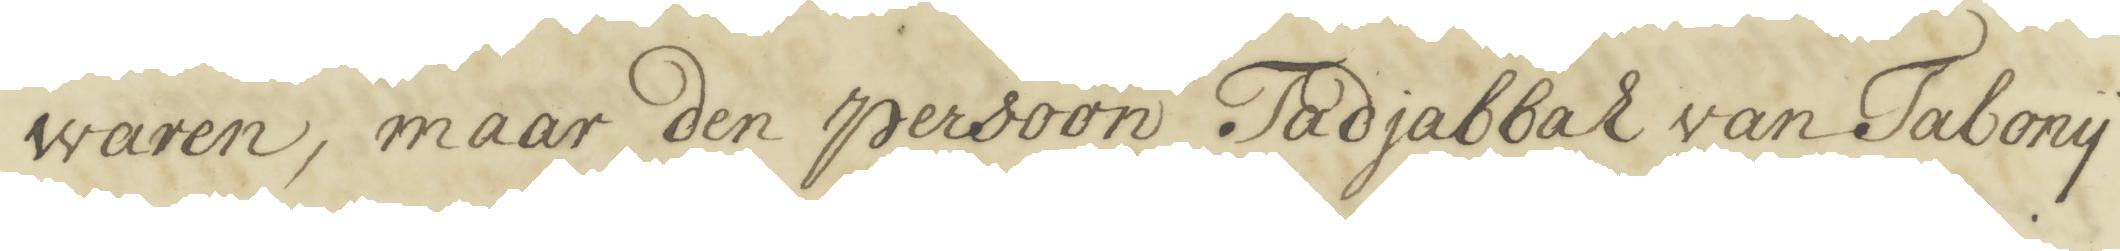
waren, maar den persoon Tadjabbah van Tabonij
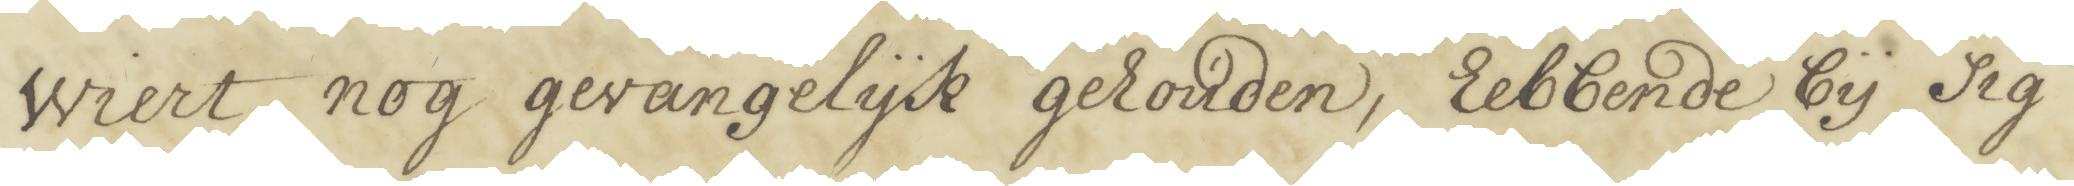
wiert nog gevangelijk gehouden, hebbende bij sig
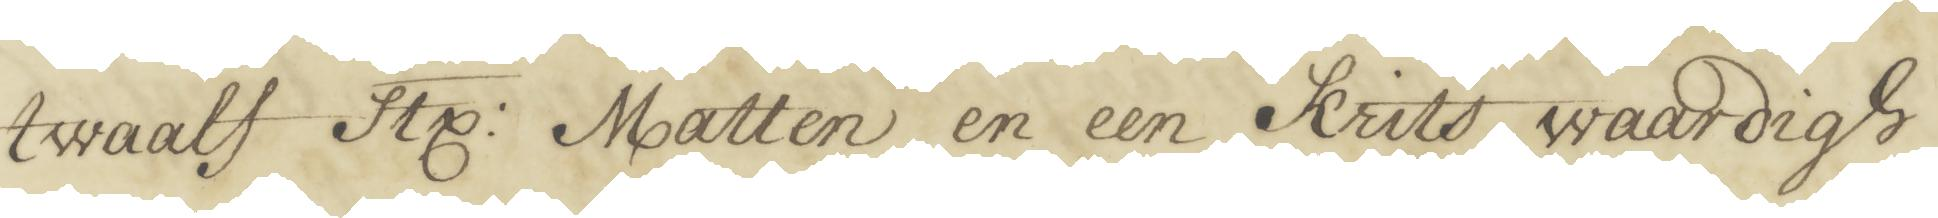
twaalf stx: Matten en een krits waardigh
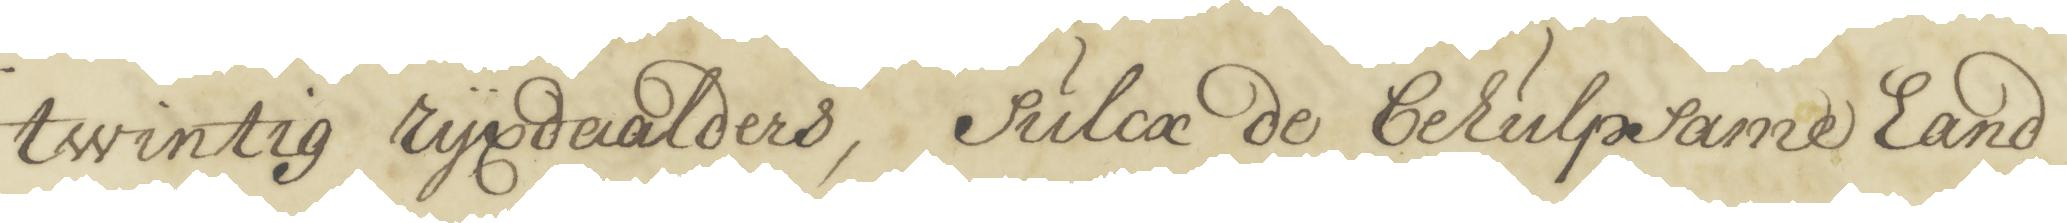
twintig rijxdaalders, sulcx de behulpsame hand
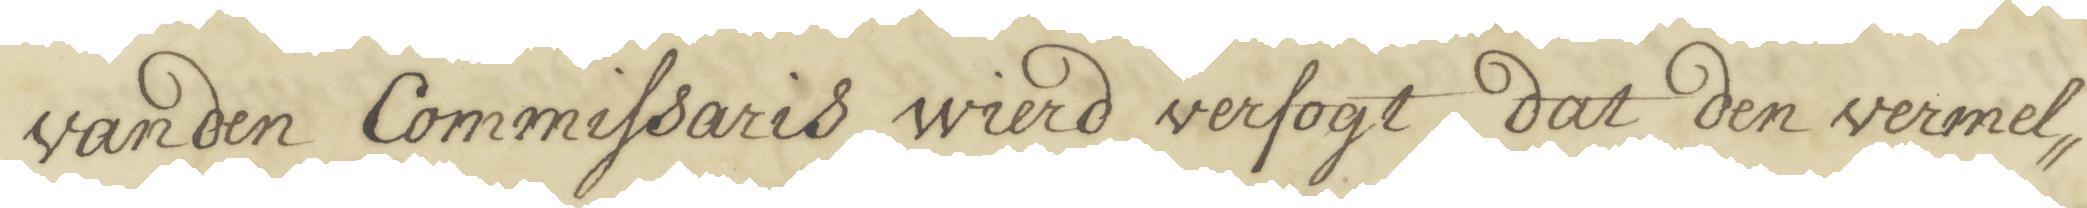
van den Commissaris wierd versogt, dat den vermel„
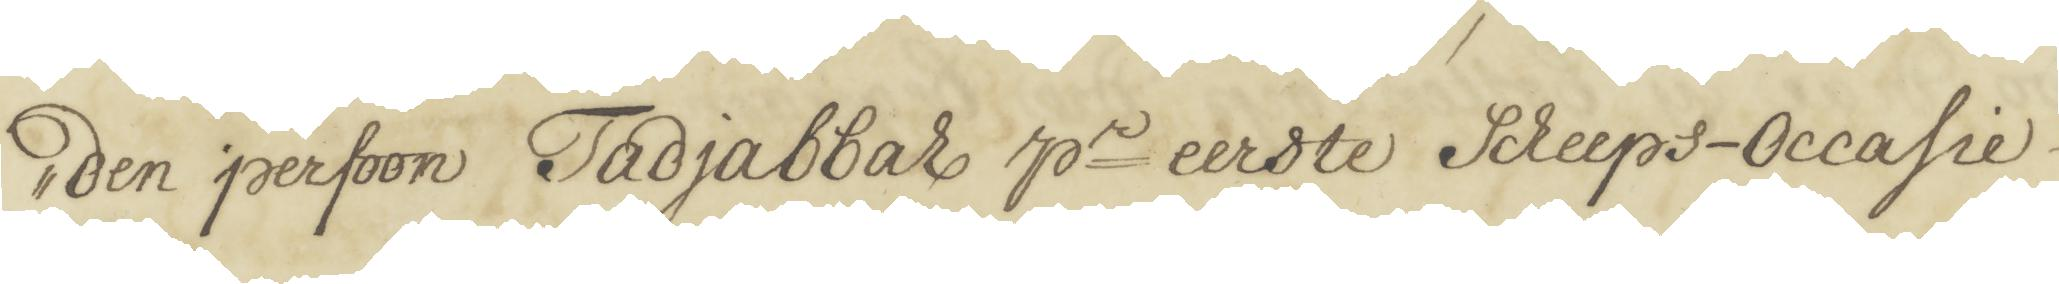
„den persoon Tadjabbah p=r eerste scheeps-Occasie
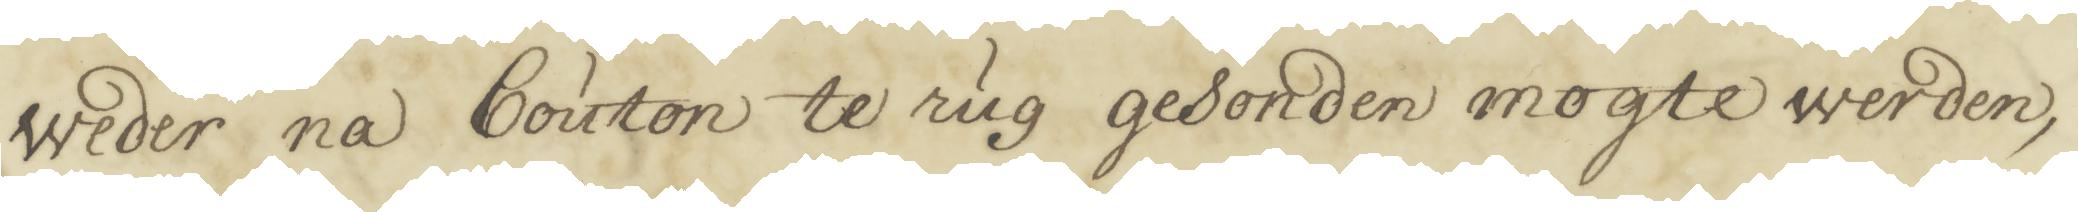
weder na bouton te rug gesonden mogte werden,
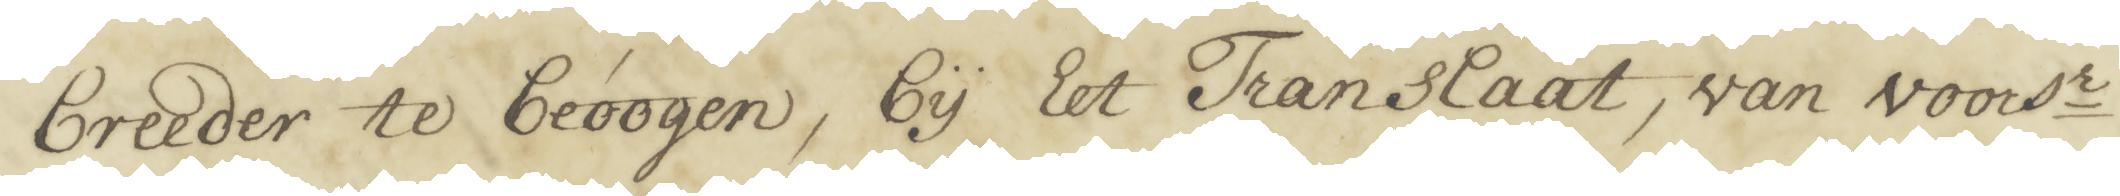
breeder te beoogen, bij het Translaat, van voors=r
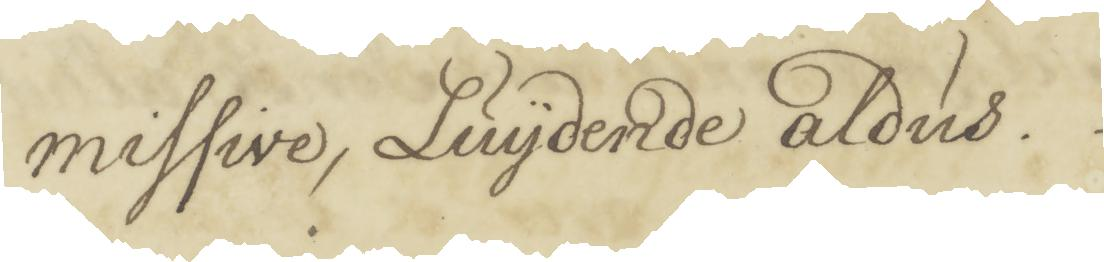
missive, Luijdende aldus.
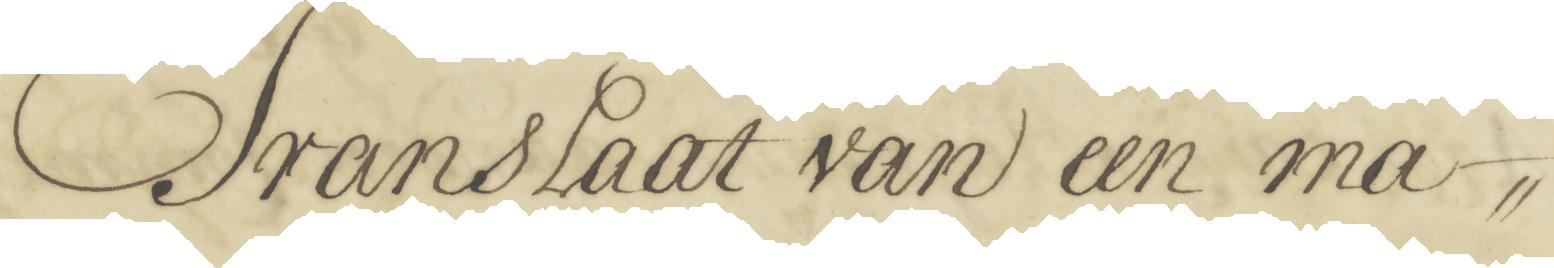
Translaat van een ma„
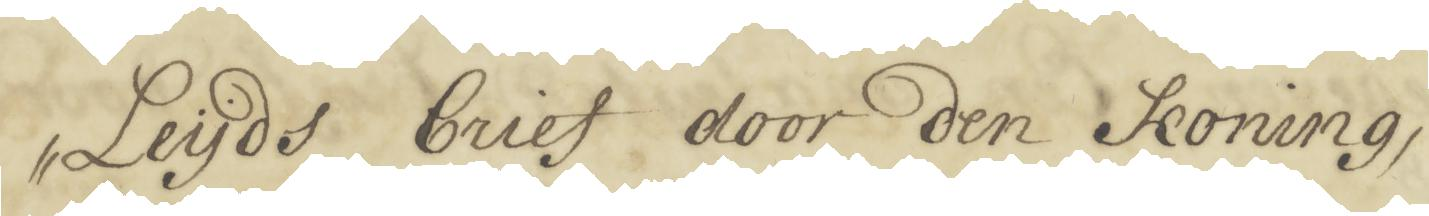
„Leijds brief door den koning,
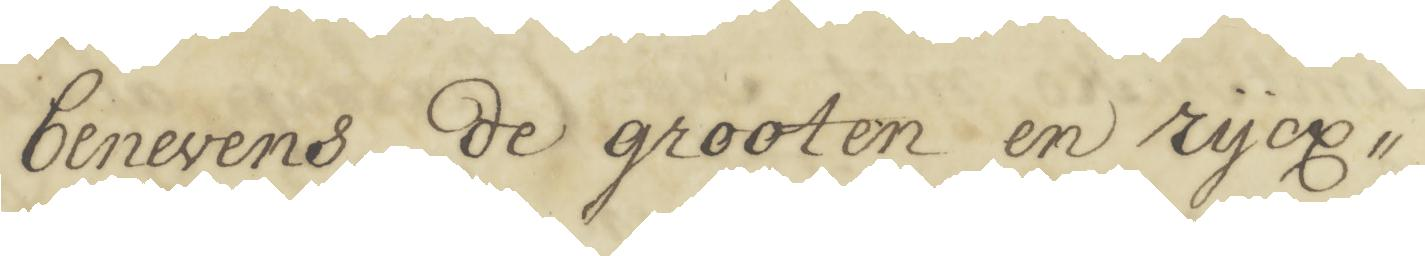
benevens de grooten en rijcx„
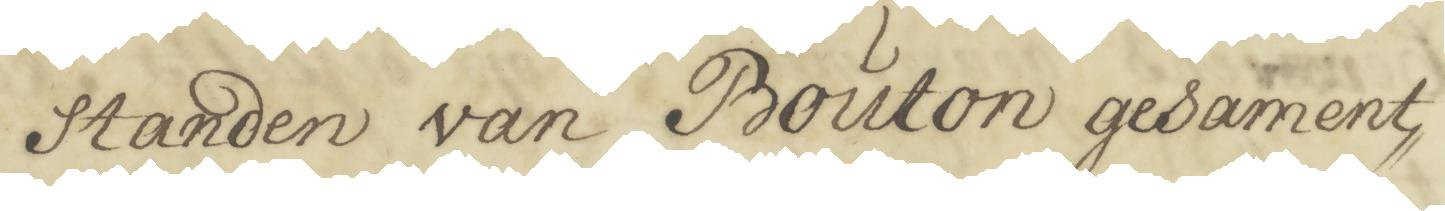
standen van Bouton gesament,
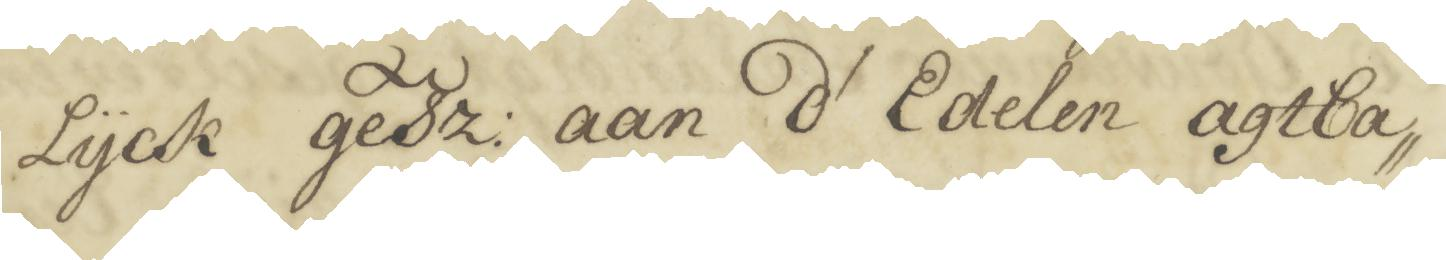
Lijck gesz: aan d’ Edelen agtba„
